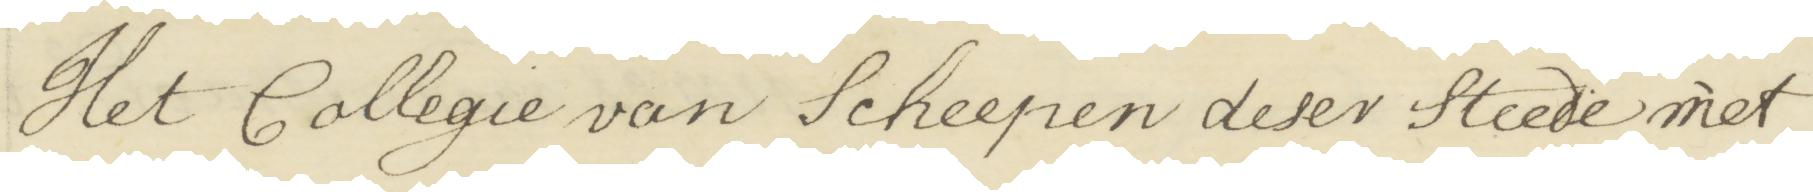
Het Collegie van Scheepen deser Steede met
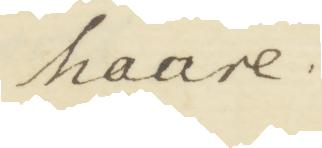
haare.
